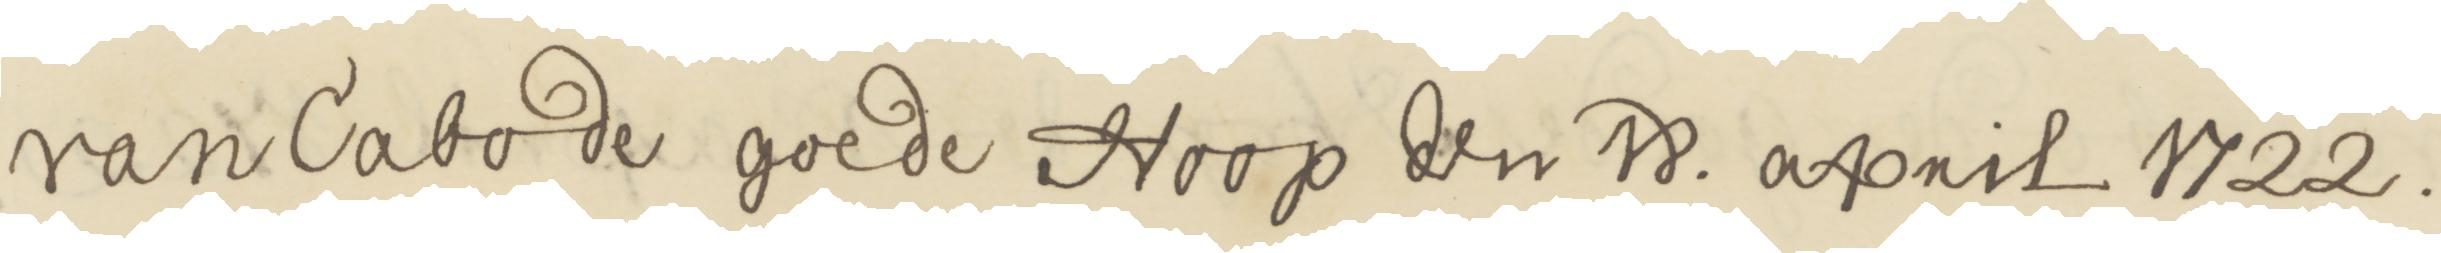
van Cabo de goede Hoop den 18. april 1722.
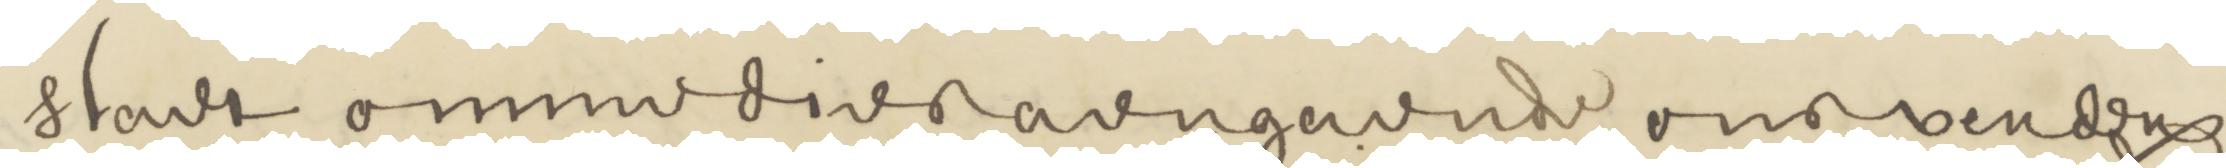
staet omme dies aengaende ons verder
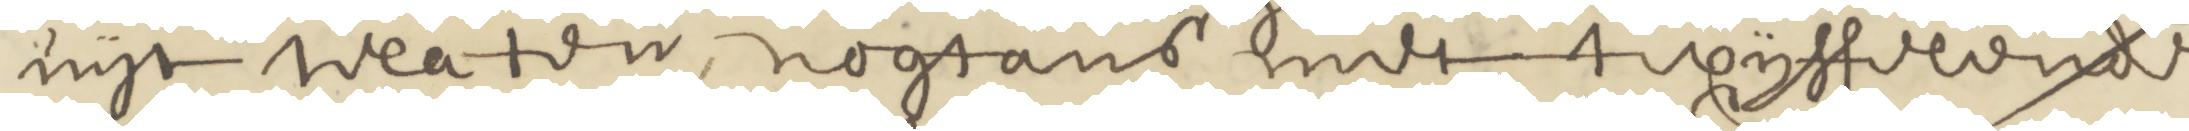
uijt telaten, nogtans niet twijffelende
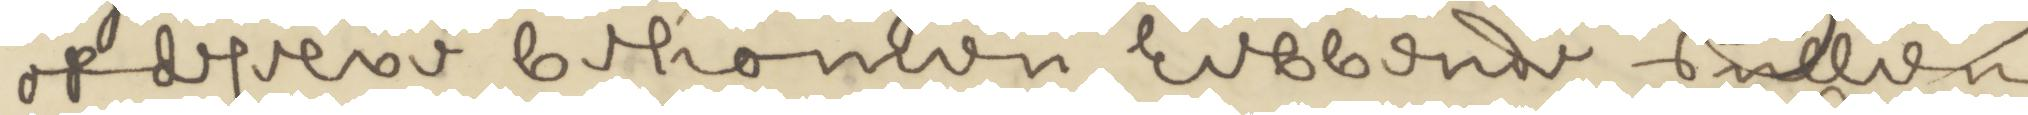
of deselve bekomen hebbende sullen
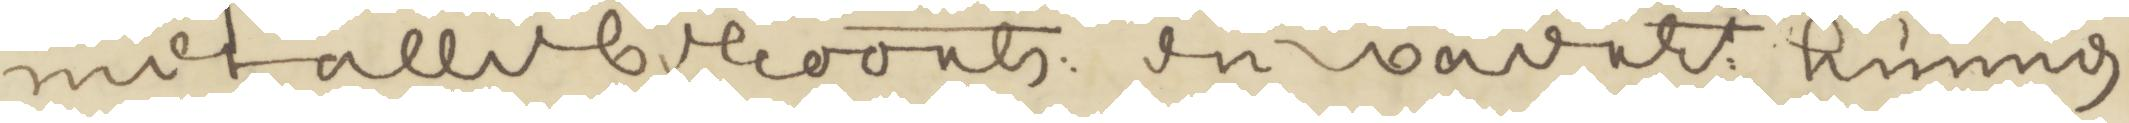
met alle behoorlijk en waerh:t kunnen
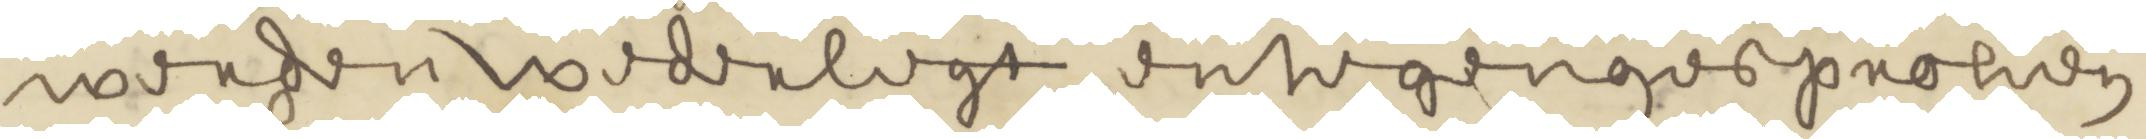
werden wederlegt en tegengesproken
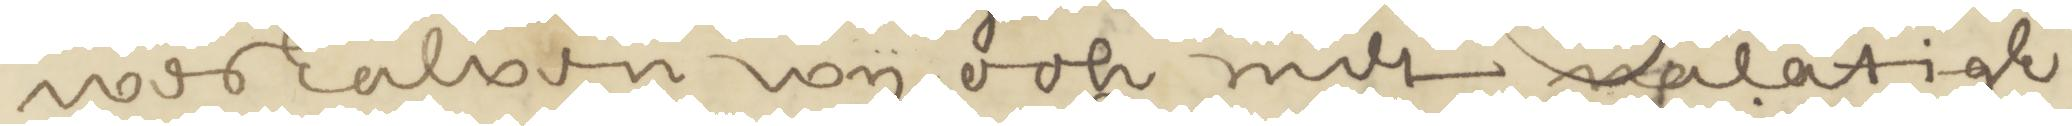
weshalven wij ook niet nalatigh
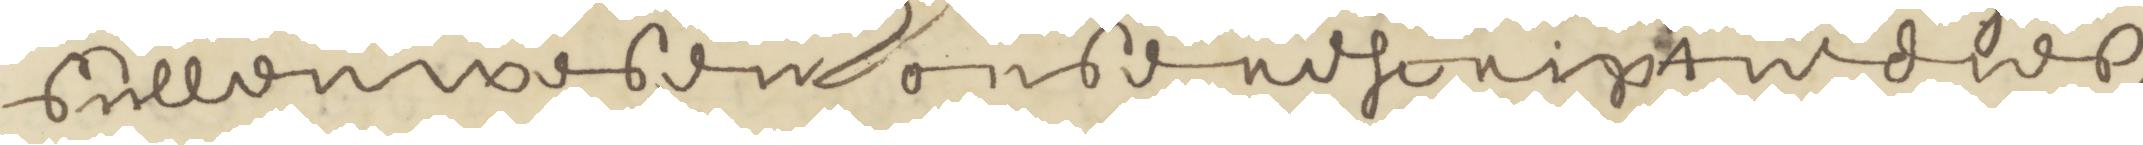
sullen wesen onse rescriptie dies
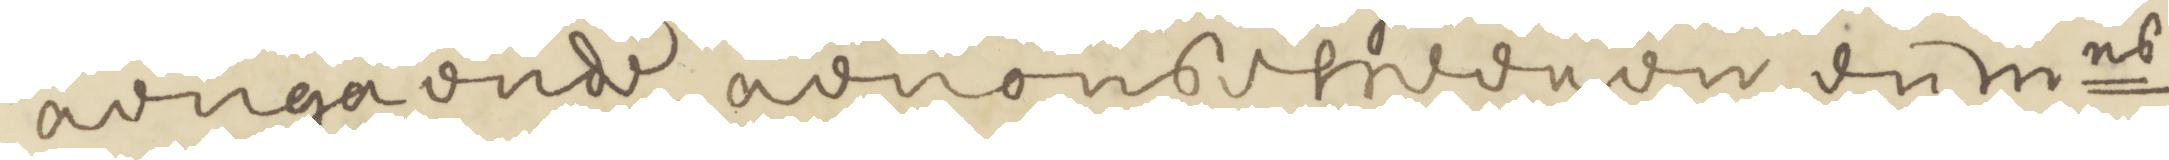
aengaende aen onse heeren en m=rs
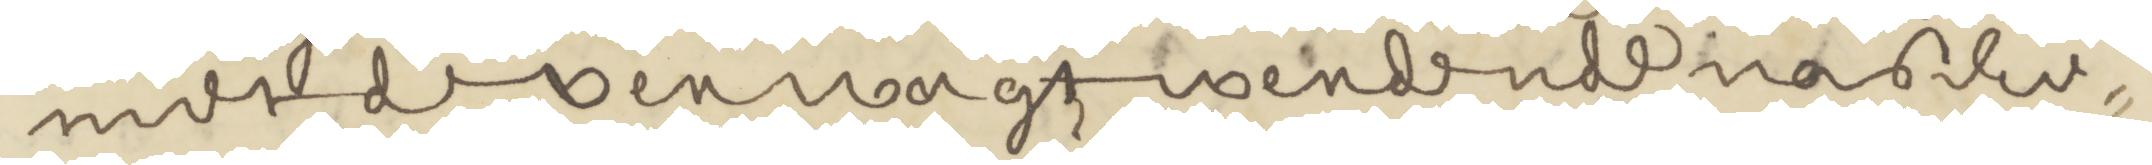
met de verwagt werdende na sche„
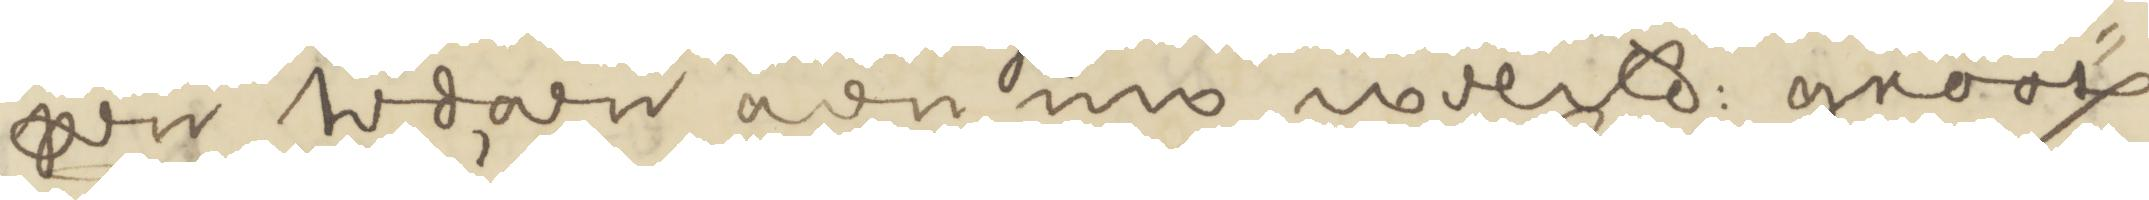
pen te doen aen uw wel Ed: groot
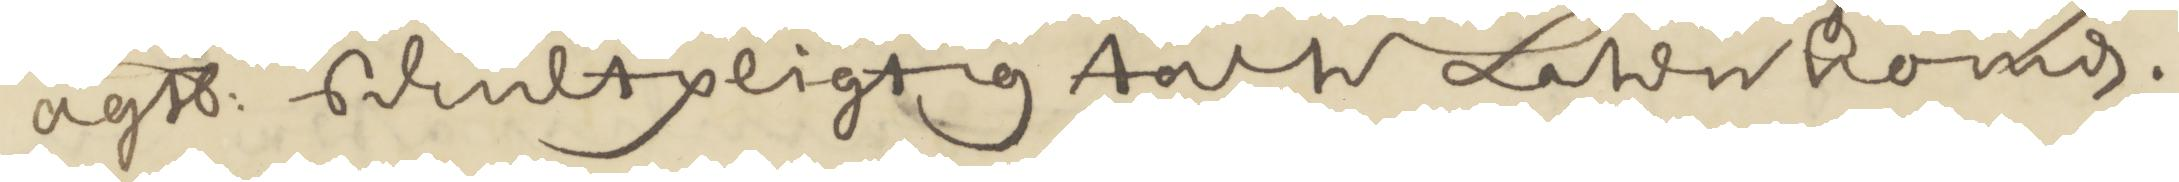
agtb: schultpligtig toe te laten komen.
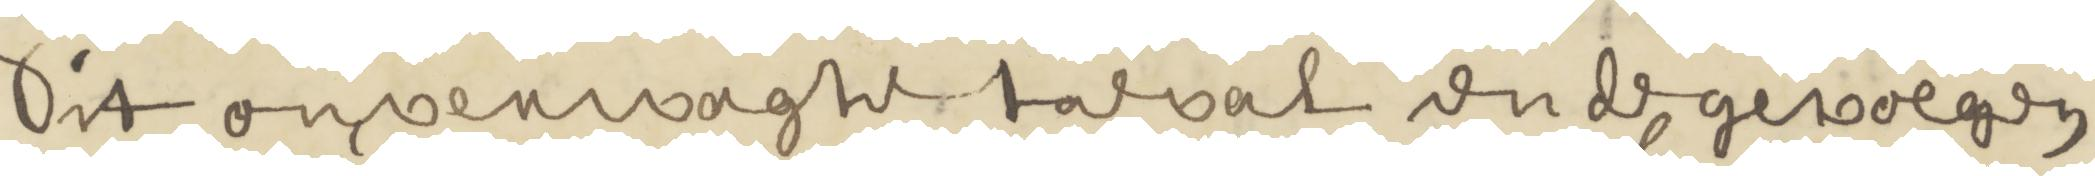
dit onverwagte toeval en de gevolgen
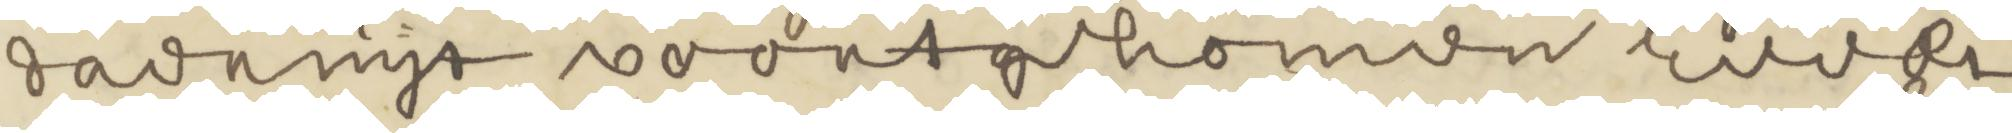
daer uijt voort gekomen heeft
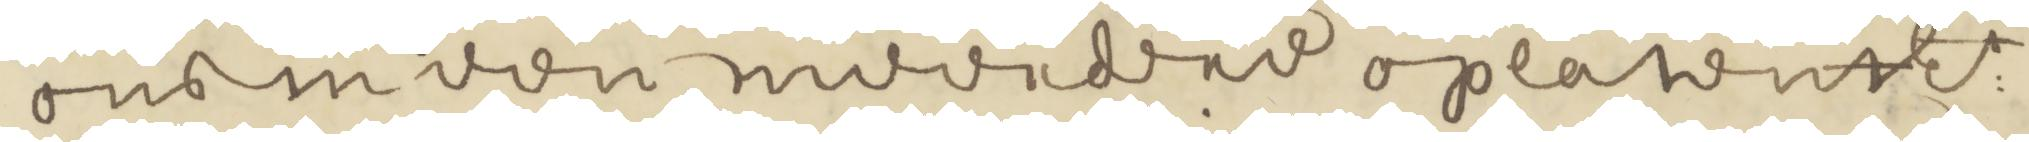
ons in een meerdere oplatenth:t
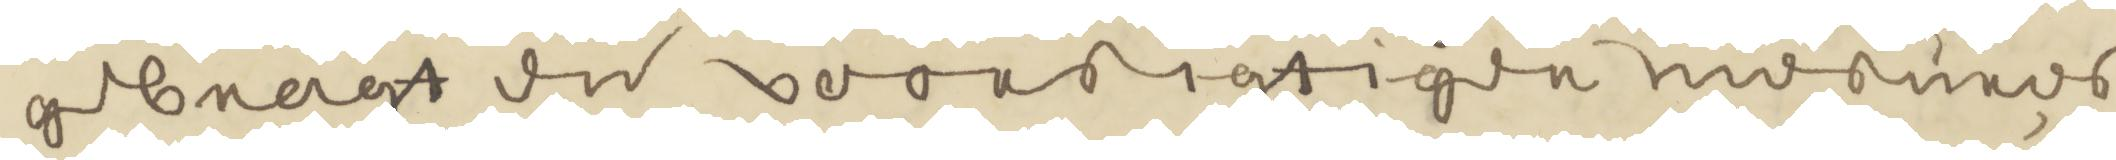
gebragt en voorsigtiger mesures
